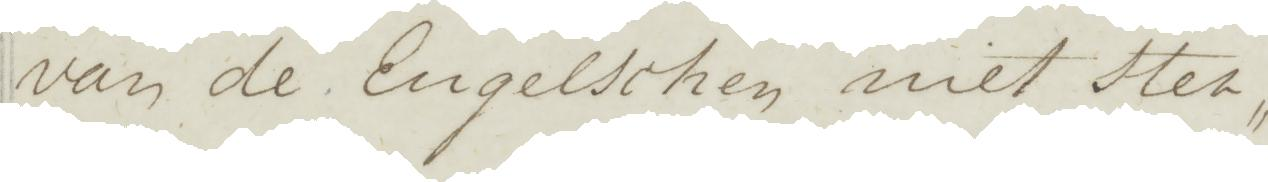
van de Engelschen niet ster„
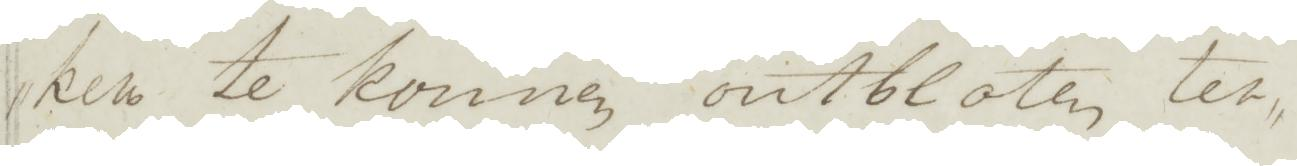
ker te konnen ontbloten ter„
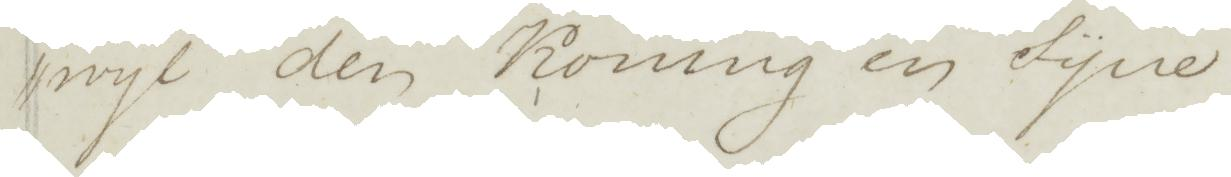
„wijl den Koning en sijne
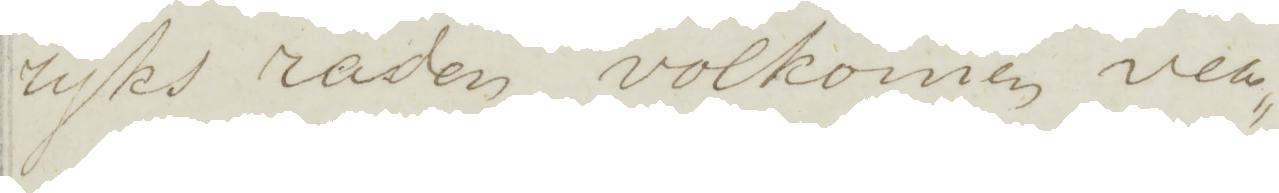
rijks raden volkomen ver„
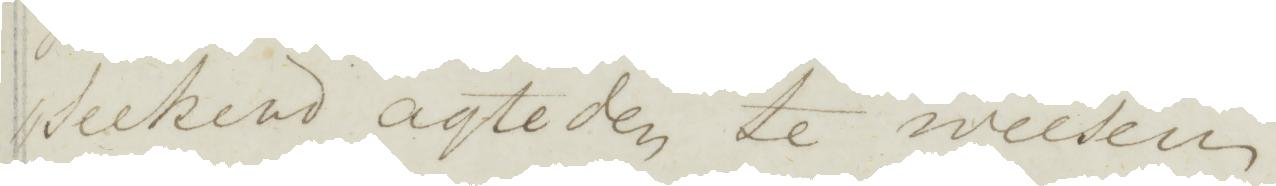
„seekerd agte den te weesen
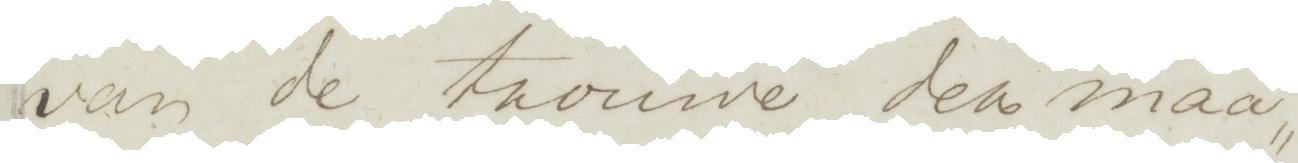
van de trouwe der maa„
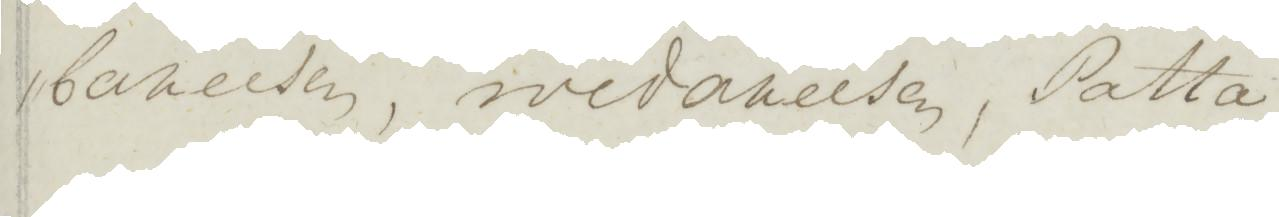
„bareesen, wedareesen, Patta„
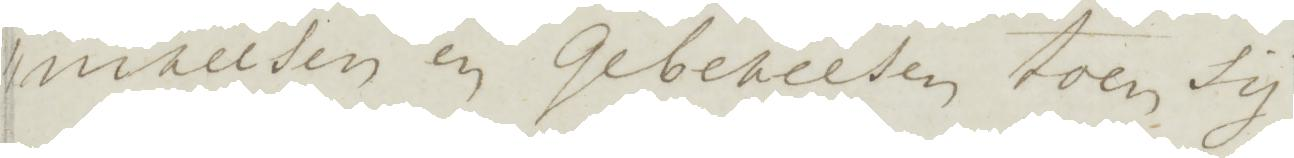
„nireesen en gebereesen toen sij
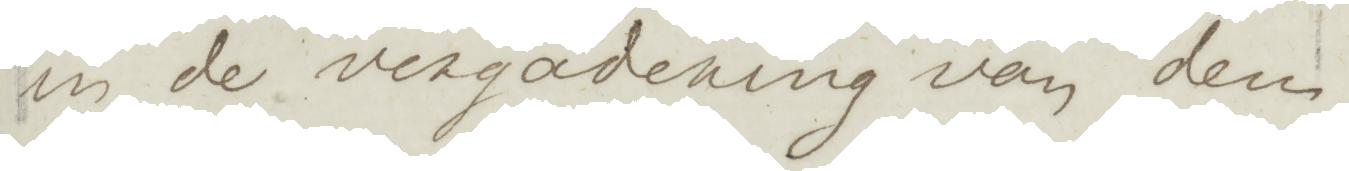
in de vergadering van den
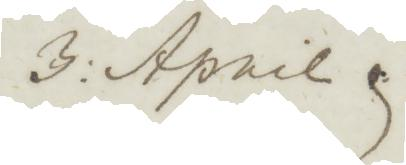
3: April :
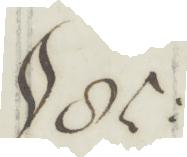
§ 85:
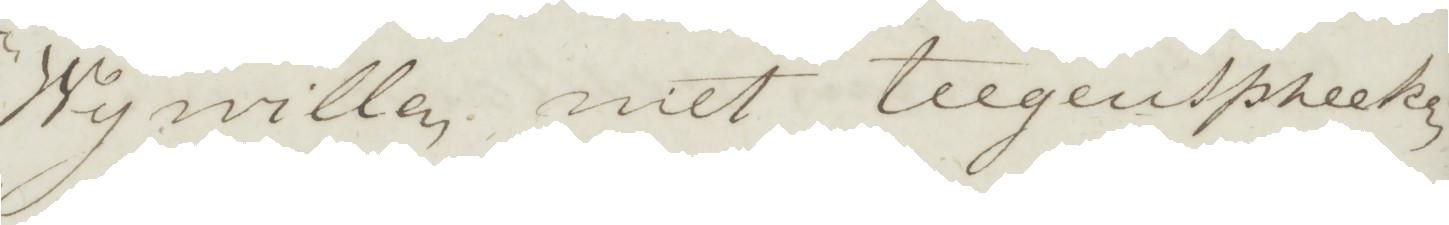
Wij willen niet teegenspreeken
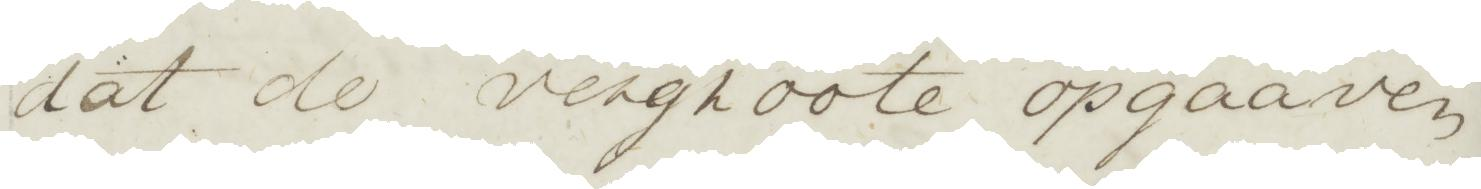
dat de vergroote opgaaven
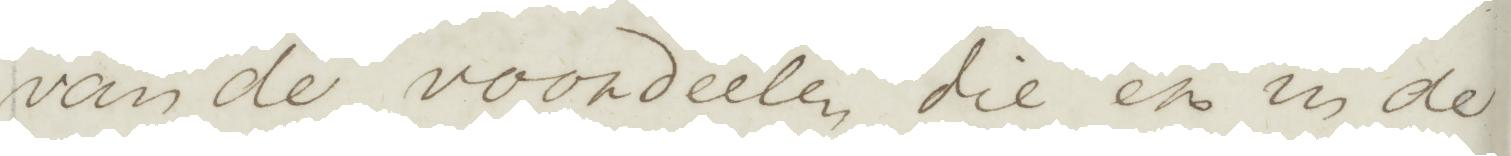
van de voordeelen die er in de
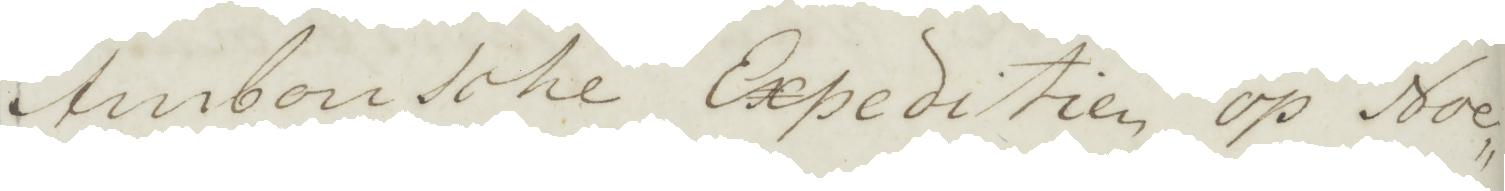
Ambonsche Expeditien op Noe„
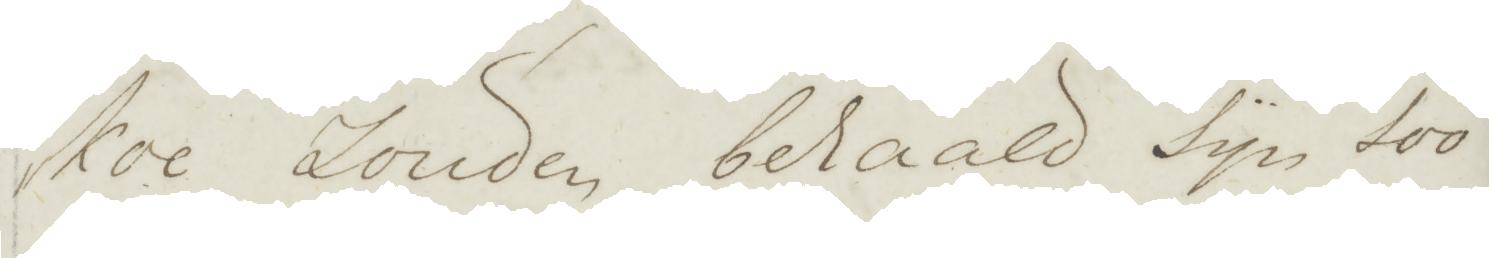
„koe zouden behaald sijn soo
